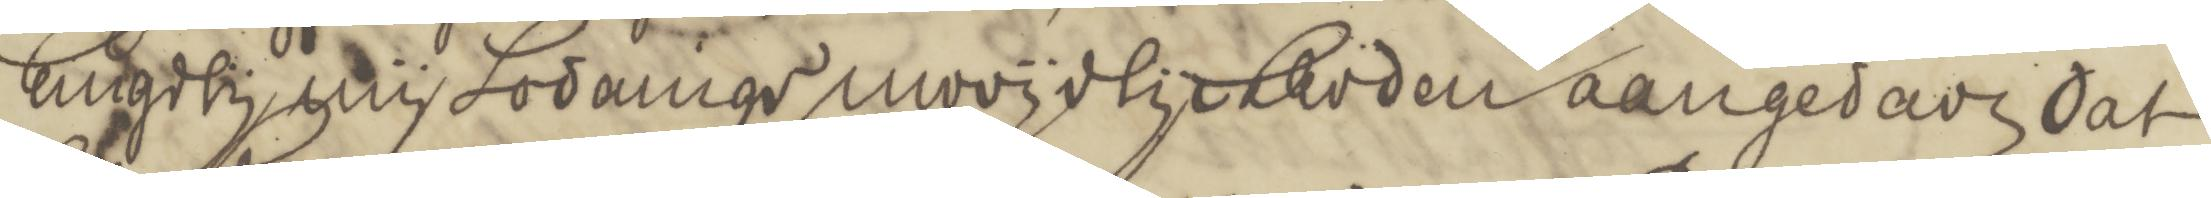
huigelij, mij sodanige moeijelijckheden aangedaen dat
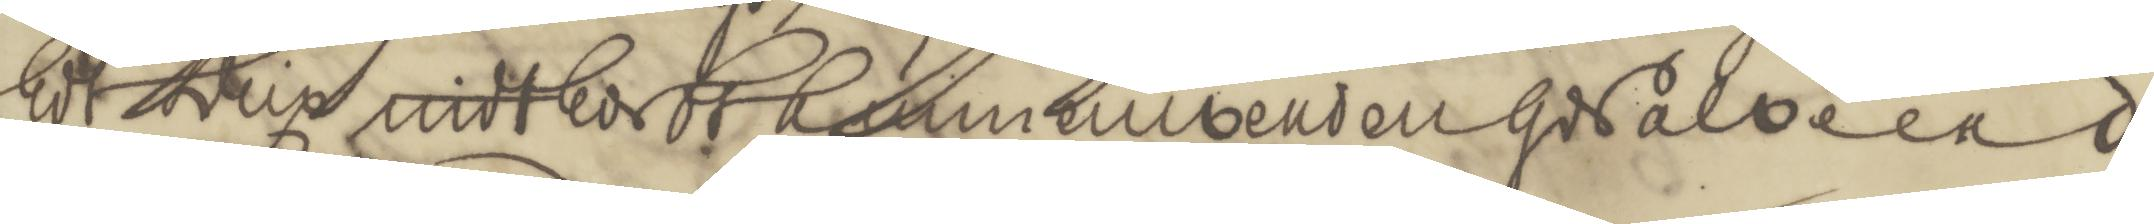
het schip niet heeft kunnen werden gesalveerd,
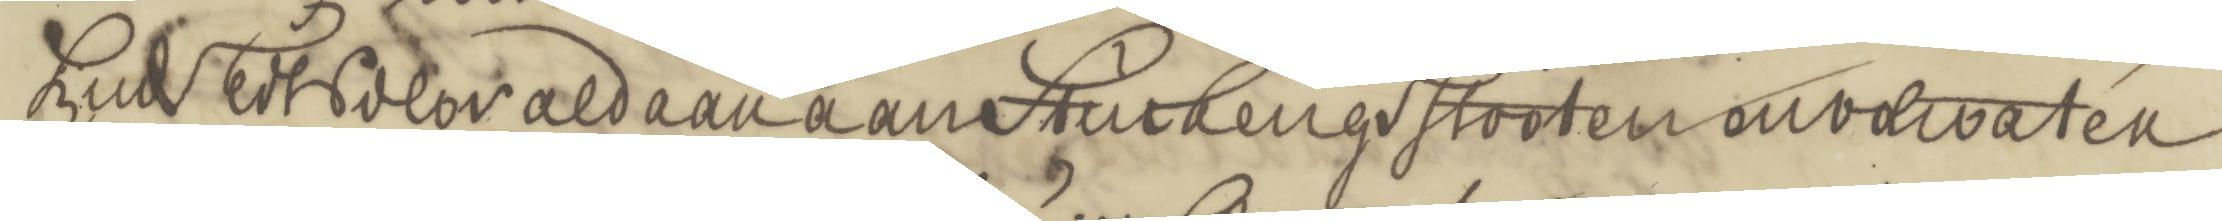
sijnde hetselve aldaar aan stucken gestooten en volwater
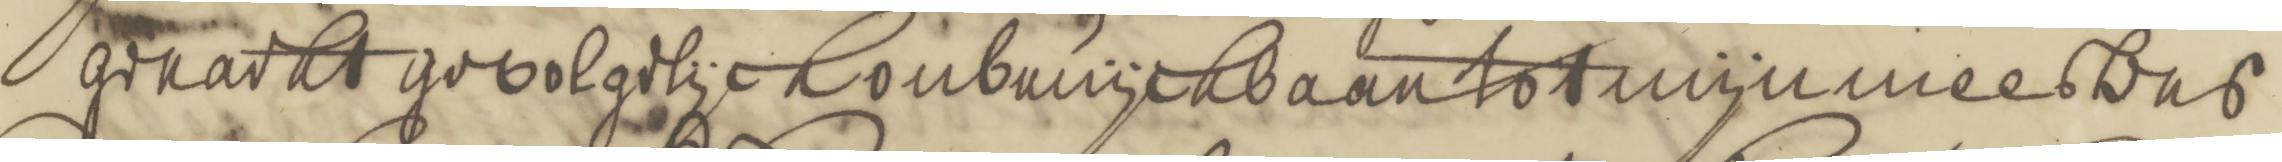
geraekt gevolgelijck onbruijckbaar tot mijn meesters
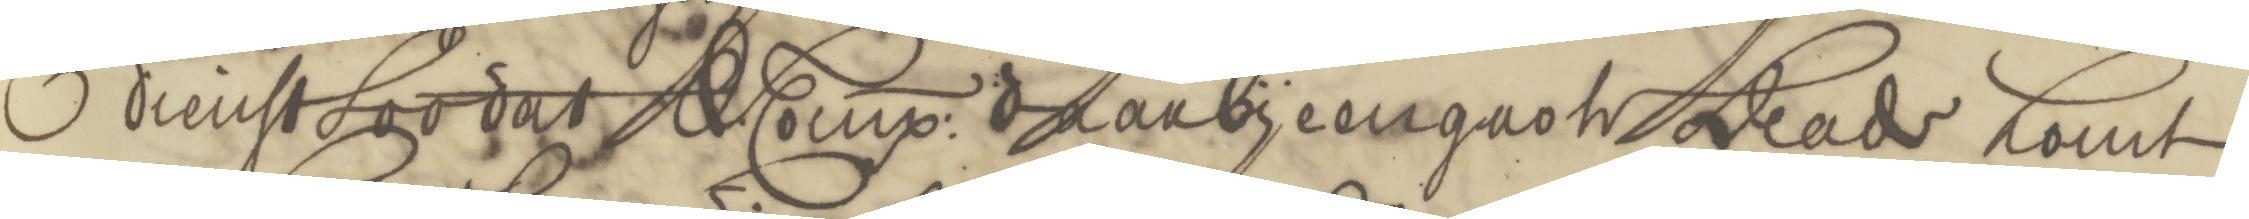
dienst soo dat E. Comp: daarbij een grote schade komt
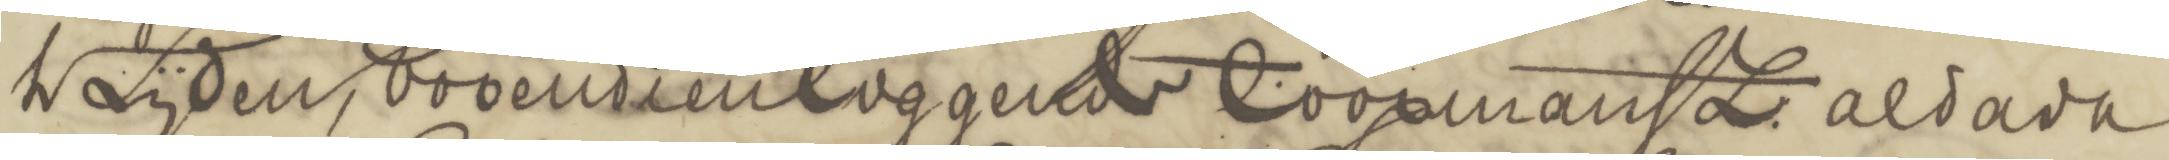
te lijden, bovendien leggende Coopmansz: aldaer
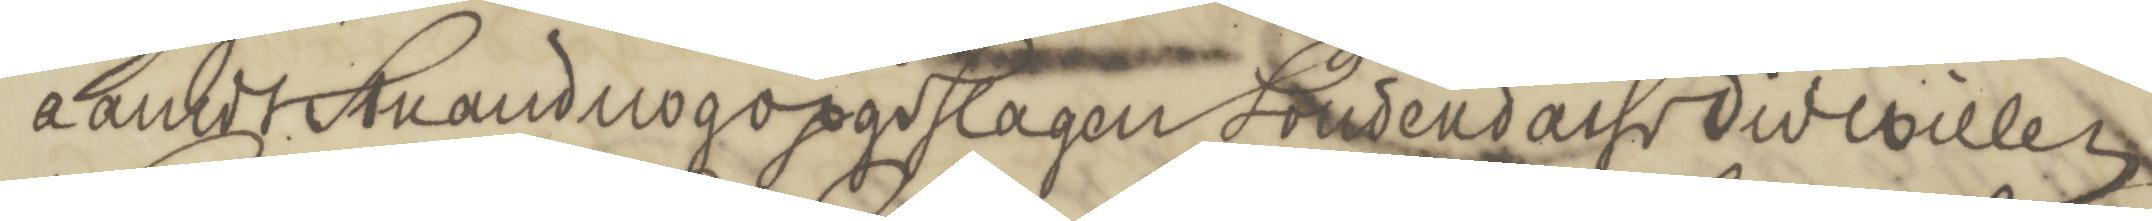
aan het strand nog opgeslagen sonder dat se die willen
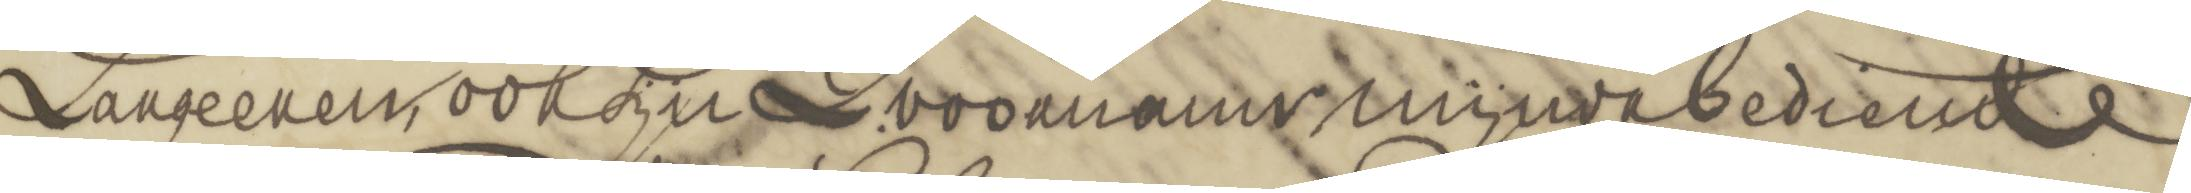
Largeeren, ook sijn 2. voorname mijner bediende
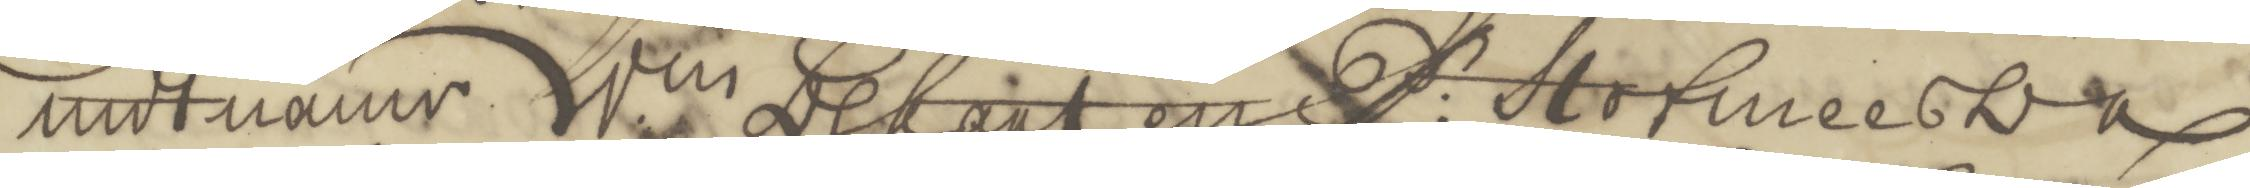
met name W:m bekant en P:r Stofmeester
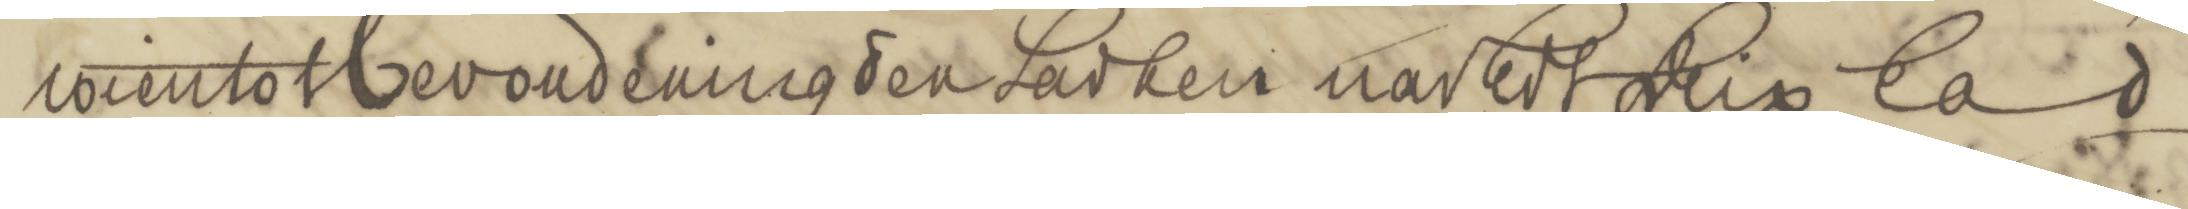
wien tot bevordering der saeken nae het schip had
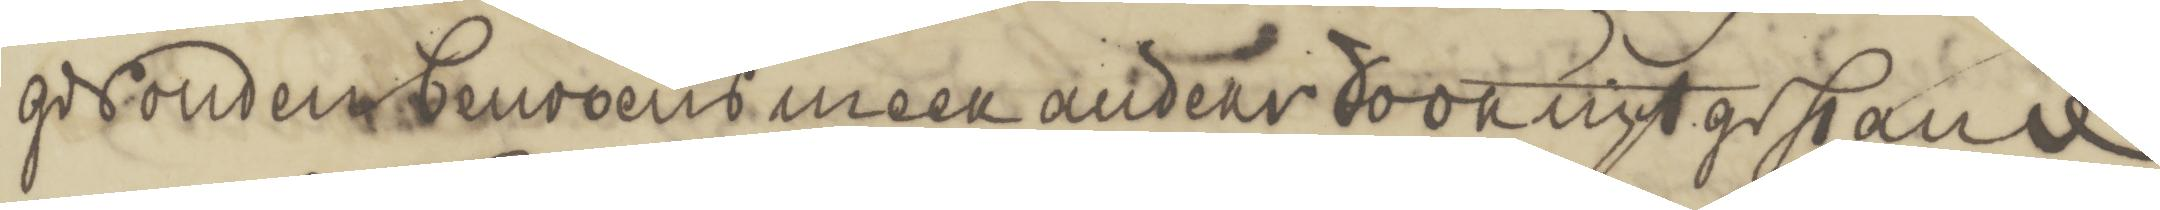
gesonden benevens meer andere door uijt gestane
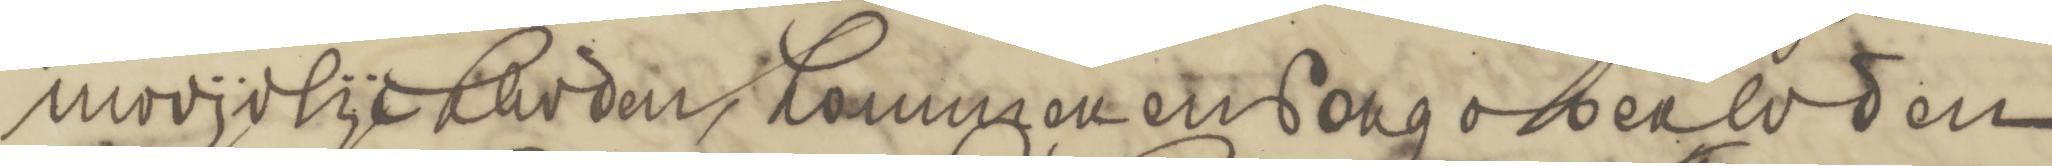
moeijelijckheden, kommer en sorg overleden
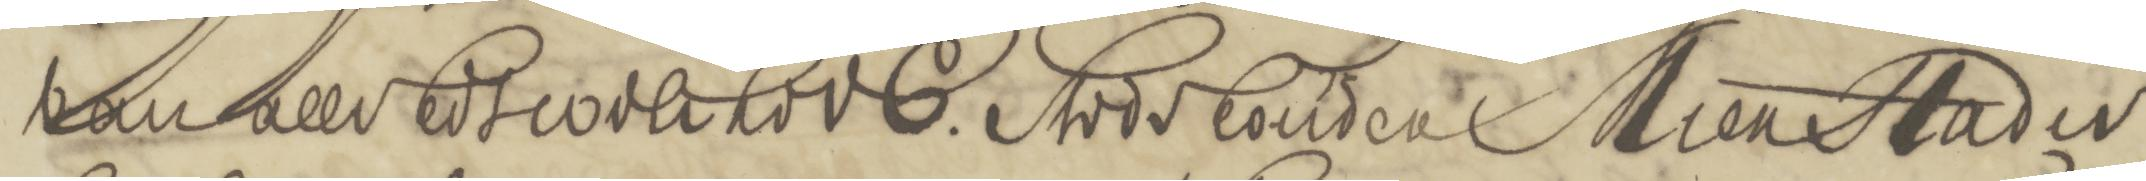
van alle hetwelcke vE. Stedehouder Mier Hadir
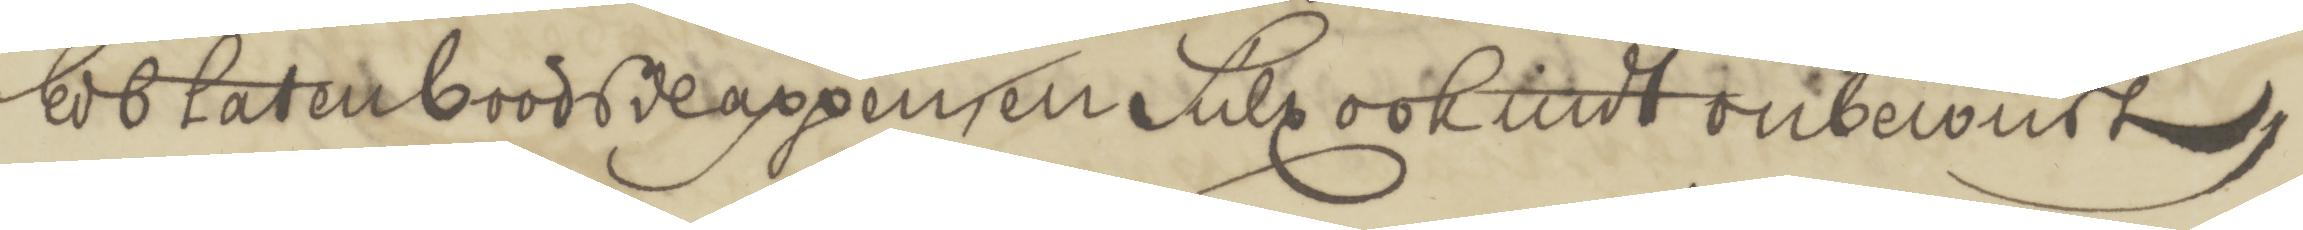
heb laten boodschappen, en sulx ook niet onbewust,
